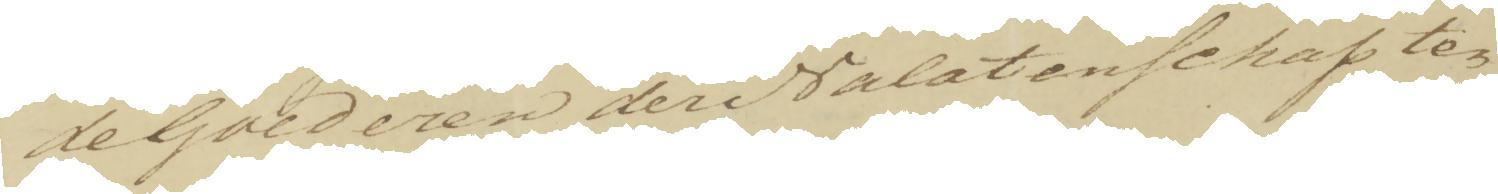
de Goederen der Nalatenschap ten
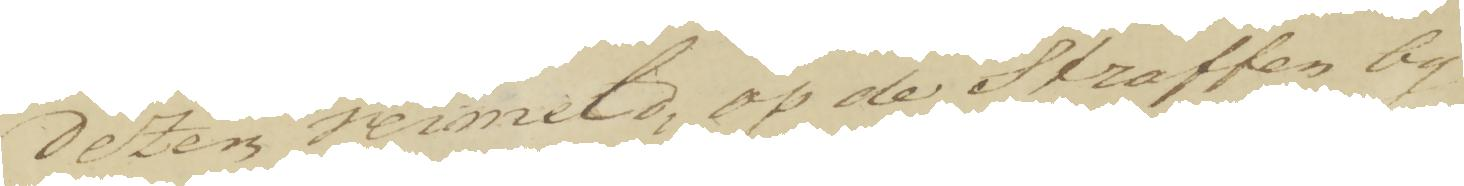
dezen vermeld, op de straffen by
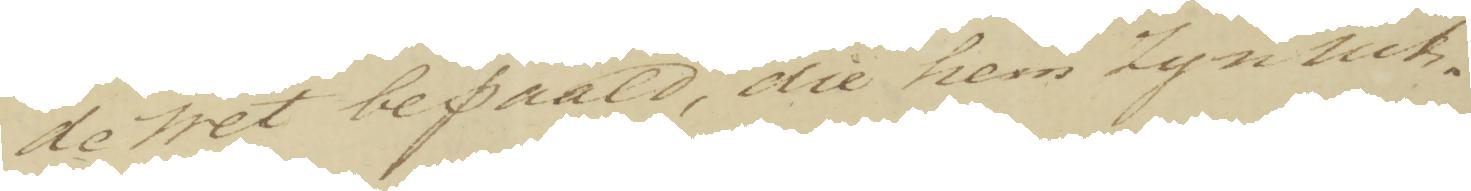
de wet bepaald, die hem zyn uit
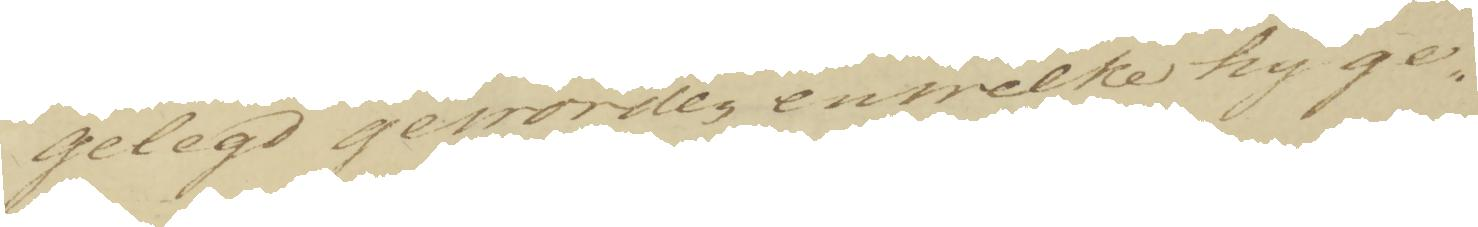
gelegd geworden en welke hy ge„
